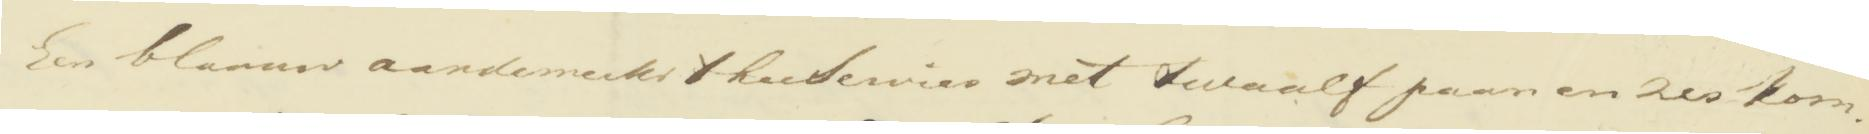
Een blaauw aardewerks theeservies met twaalf paar en zes kom
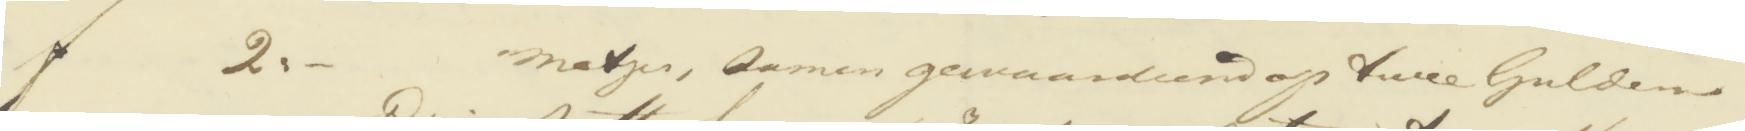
ƒ 2:– 'metjes, zamen gewaardeerd op twee Guldens
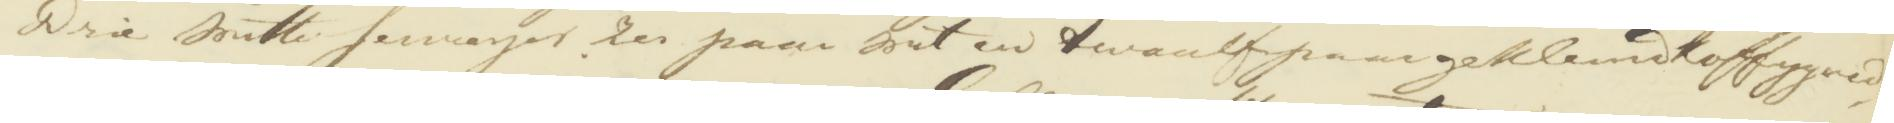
Drie witte serviesjes zes paar wit en twaalf paar gekleurd koffygoed,
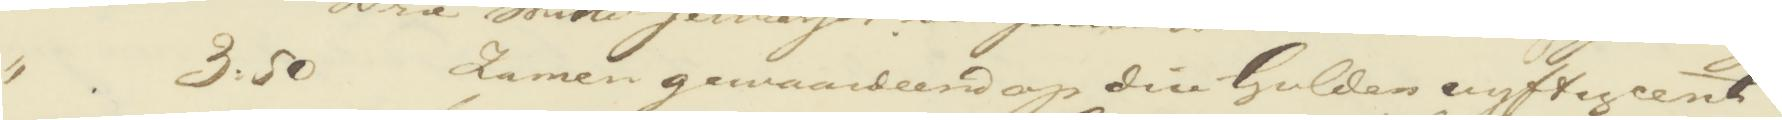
„ . 3:50 zamen gewaardeerd op drie Gulden vijftig cents
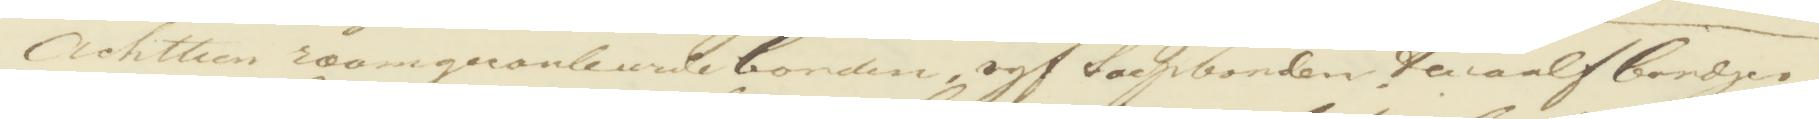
Achttien roomgecouleurde borden, vyf soepborden twaalf bordjes
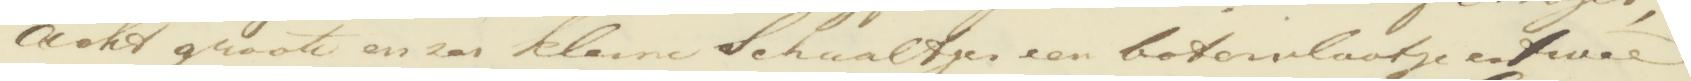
acht groote en zes kleine schaaltjes een botervlootje en twee
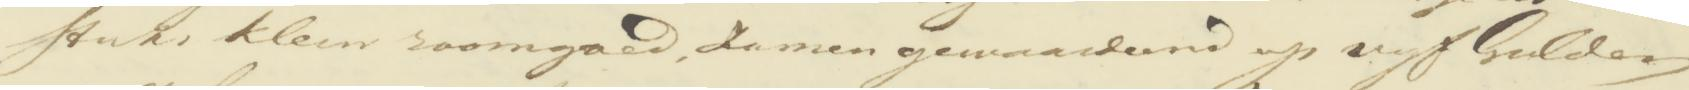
stuks klein roomgoed, zamen gewaardeerd op vyf Gulden
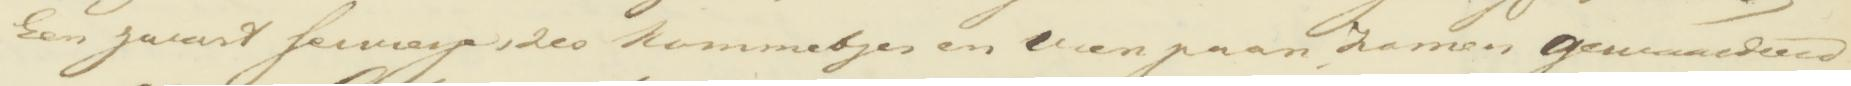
Een zwart serviesje, zes kommetjes en vier paar, zamen gewaardeerd
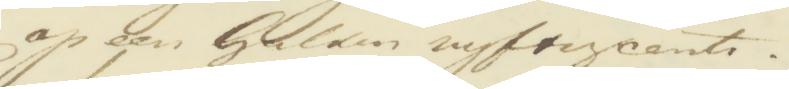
op een Gulden vyftig cents.
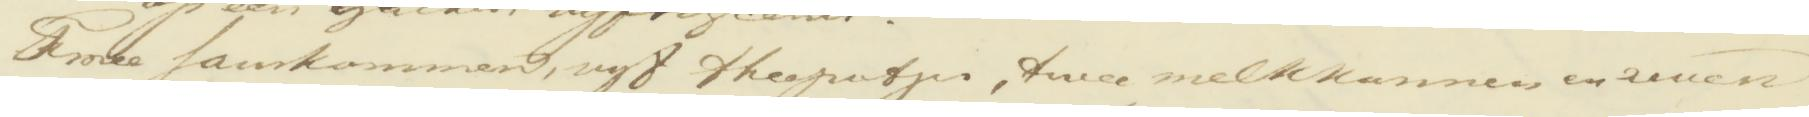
Twee sauskommen, vyf theepotjes, twee melkkannen en zeven
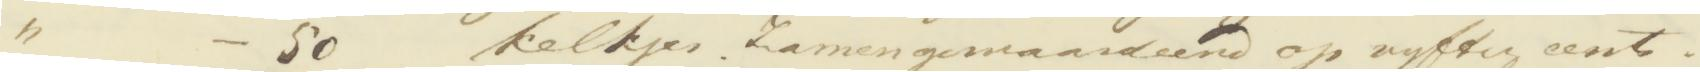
„ – 50 kelkjes, zamen gewaardeerd op vyftig cents.
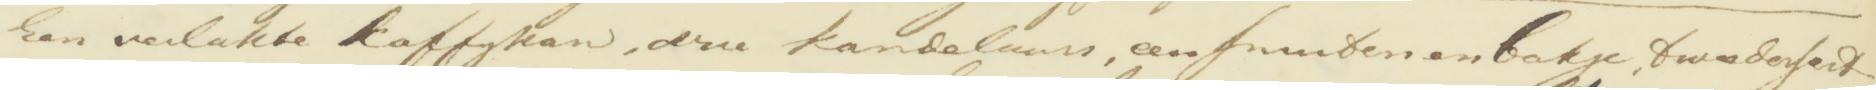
Een verlakte koffykan, drie kandelaars, een fnuiten en bakje, tweedessert
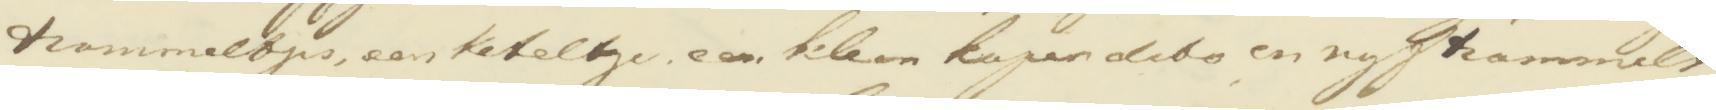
trommeltjes, een keteltje, een klein koper dito en vyf trommels
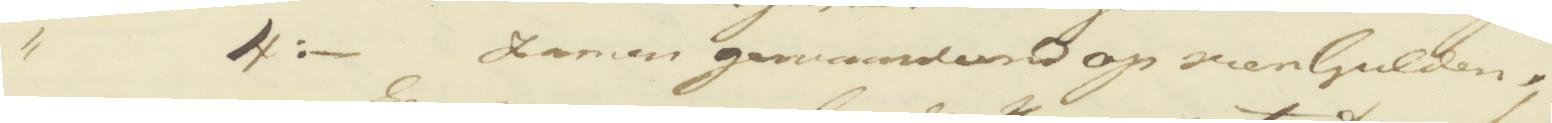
„ 4: — zamen gewaarderd op vier Gulden„
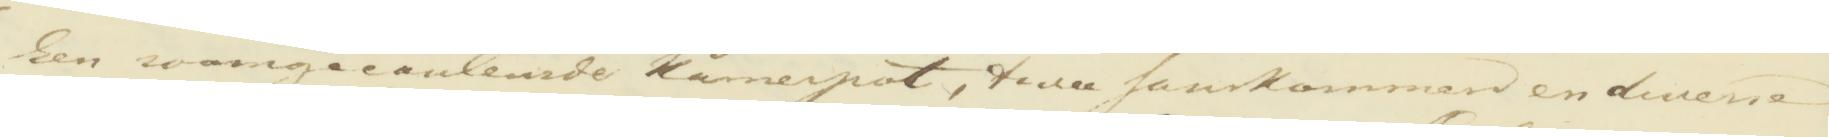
Een roomgecouleurde kamerpot, twee Jaarkommen en diverse
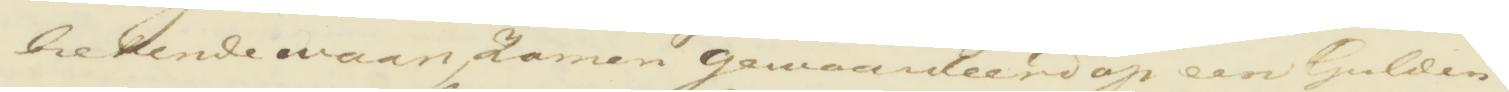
brekende waar, zamen gewaardeerd op een Gulden
